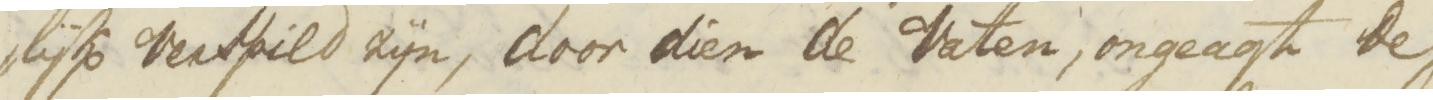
lijk verspild zijn, door dien de vaten, ongeagt de
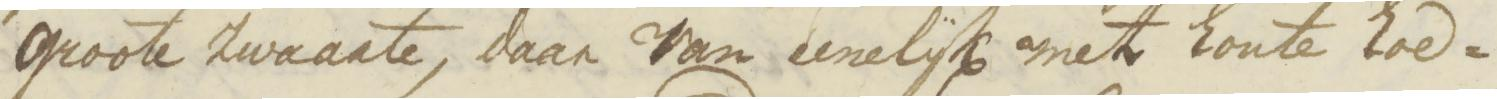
groote zwaarte, daar van eenelijk met houte hoe„
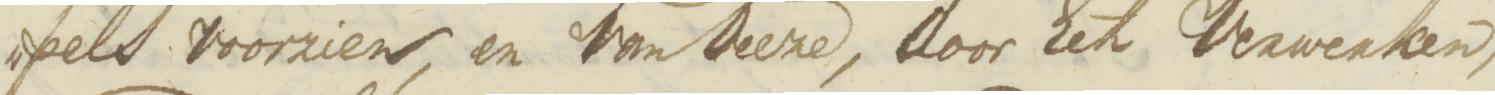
„pels voorzien, en van deeze, door het verwerken,
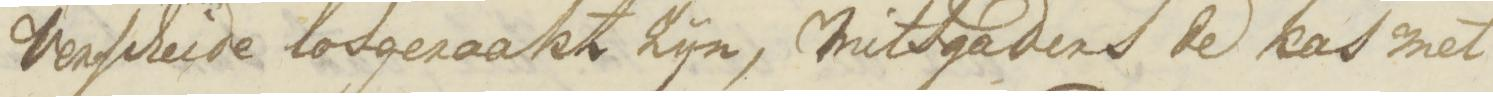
verspreide losgeraakt zijn, mitsgaders de kas met
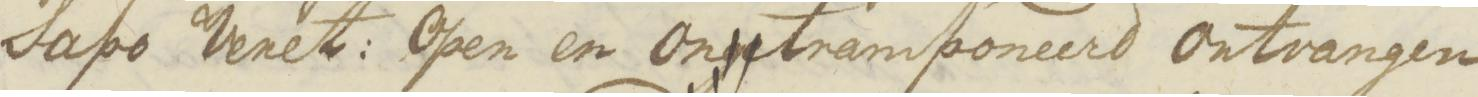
sapo venet: open en ongtramponeerd ontvangen
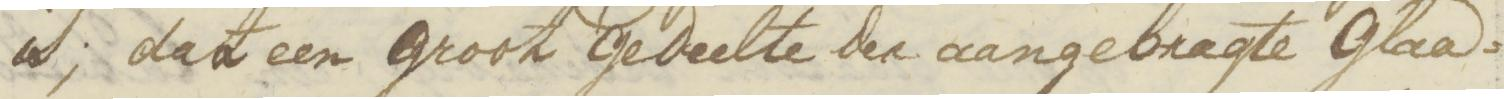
is, dat een groot gedeelte der aangebragte Glaa„
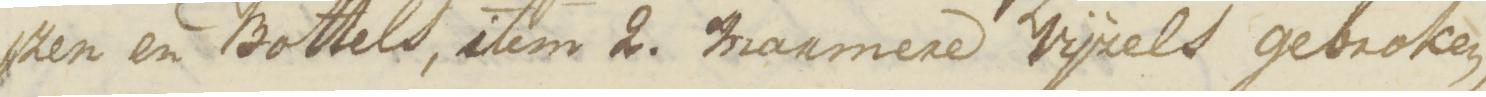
zen en Bottels, item 2. marmere vijzels gebroken,
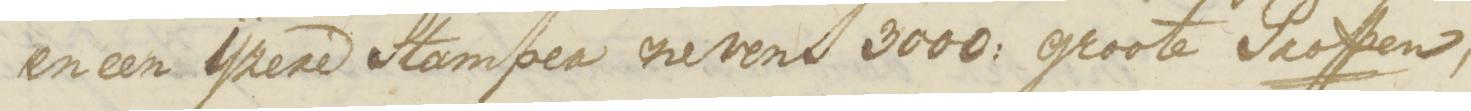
en een ijzere stamper nevens 3000: groote Proppen,
